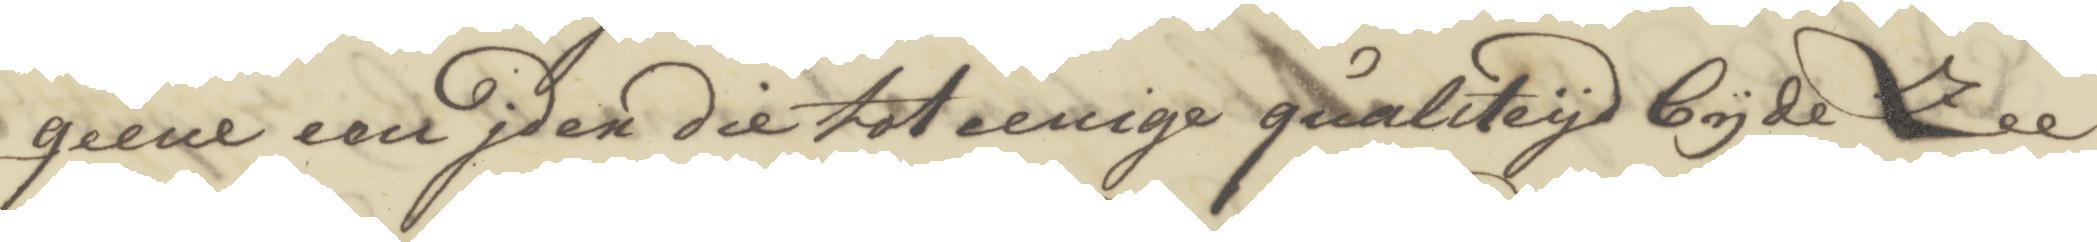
geene een jder die tot eenige qualiteijd bij de zee
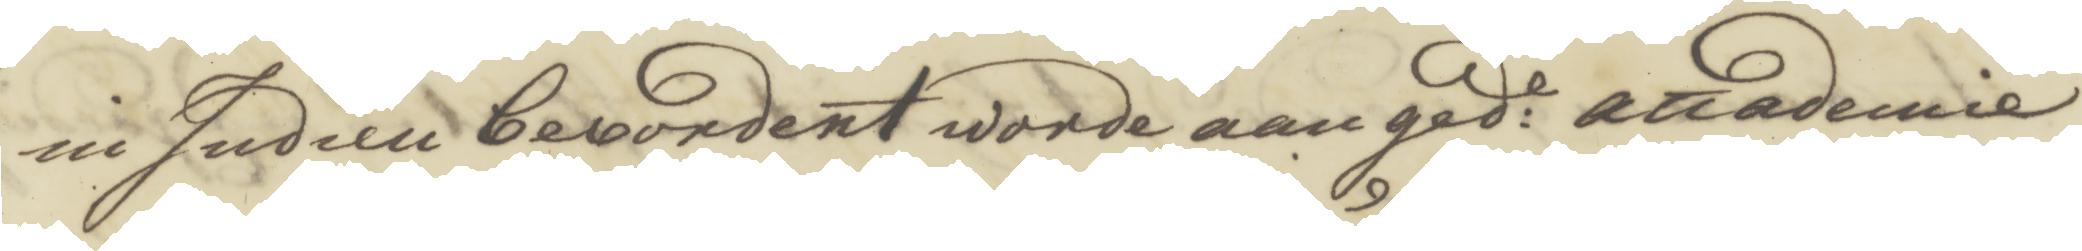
in Jndien bevordent worde aan ged:e accademie
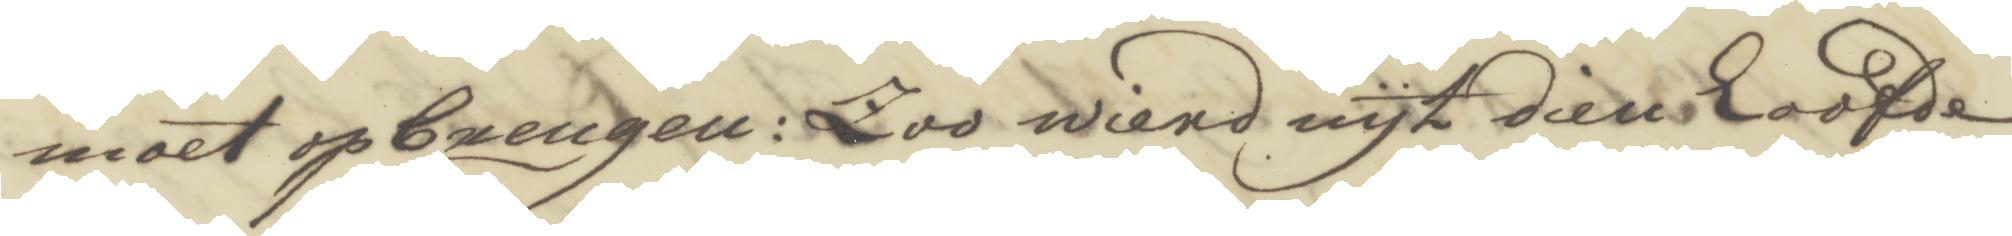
moet op brengen: zoo wierd uijt dien hoofde
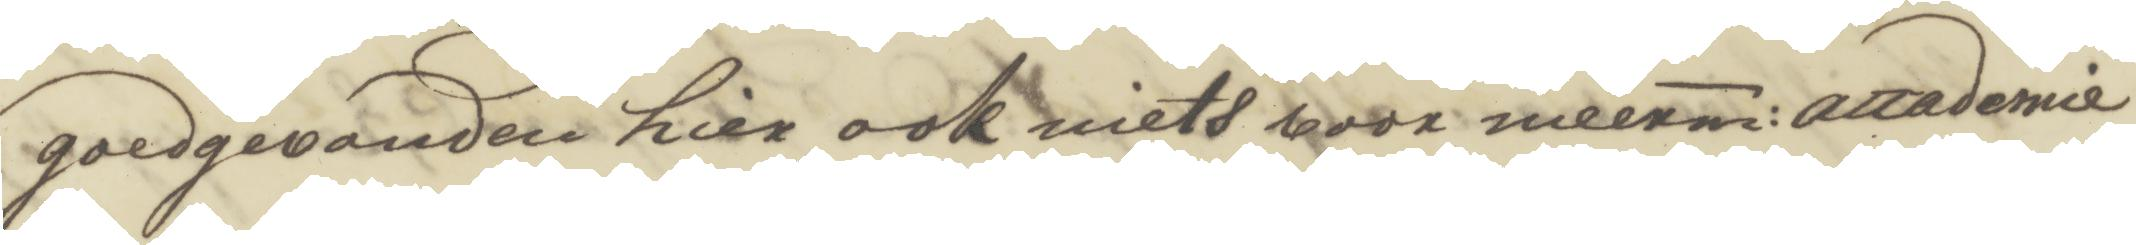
goedgevonden hier ook niets voor meerm: accademie
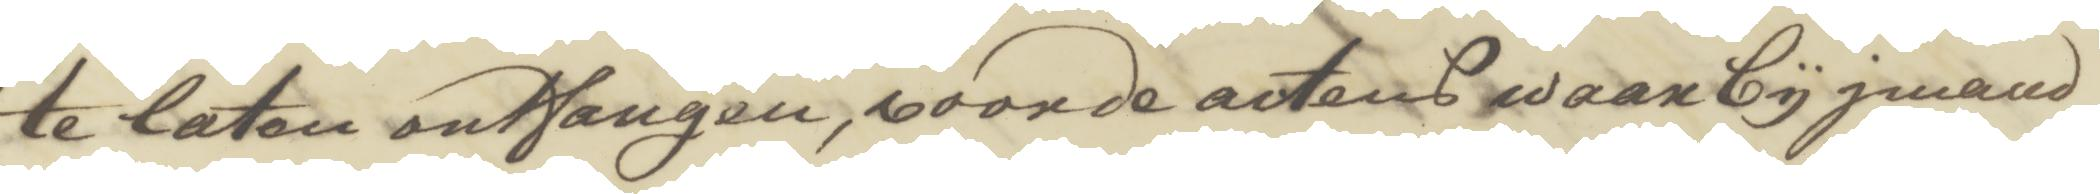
te laten ontfangen, voor de actens waar bij jmand
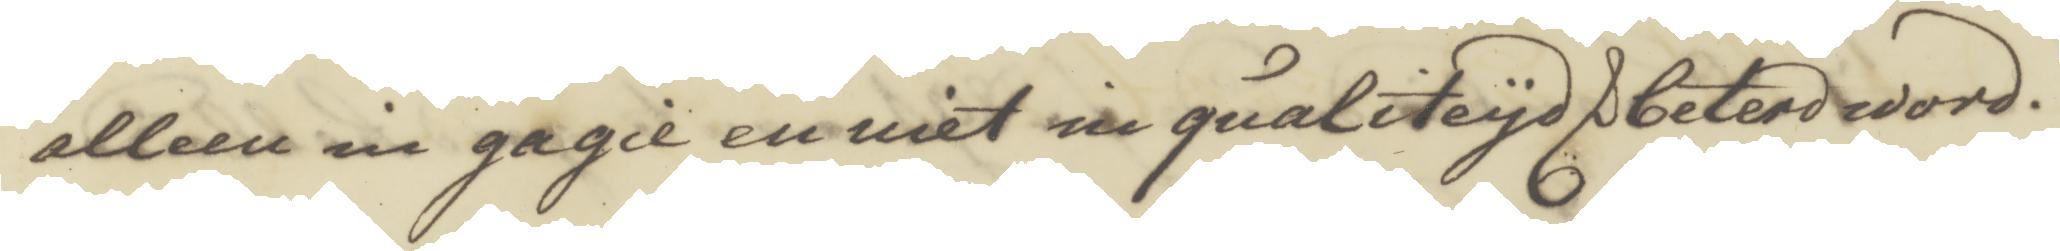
alleen in gagie en niet in qualiteijd verbeterd word.
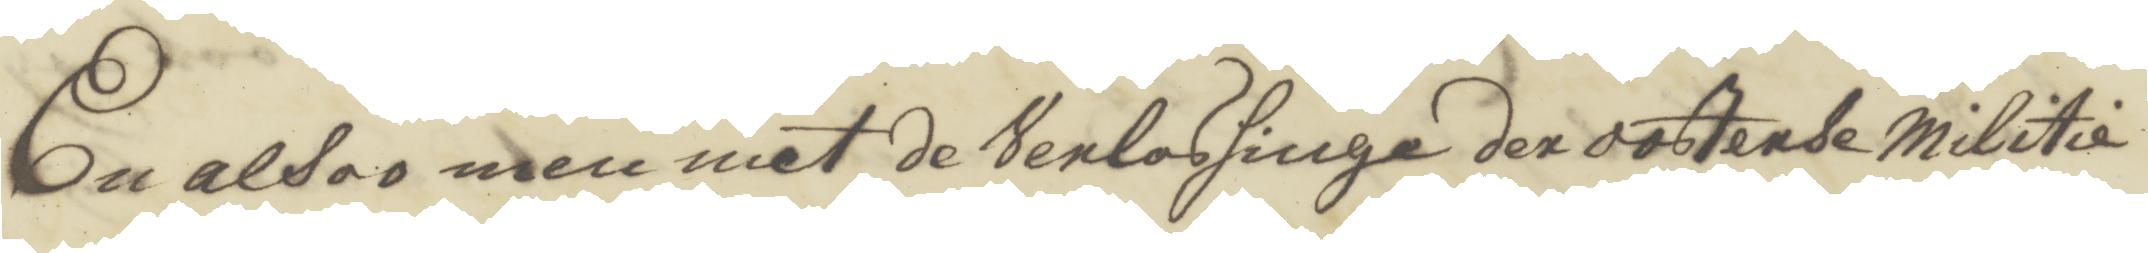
En alsoo men met de verlossinge der oosterse militie
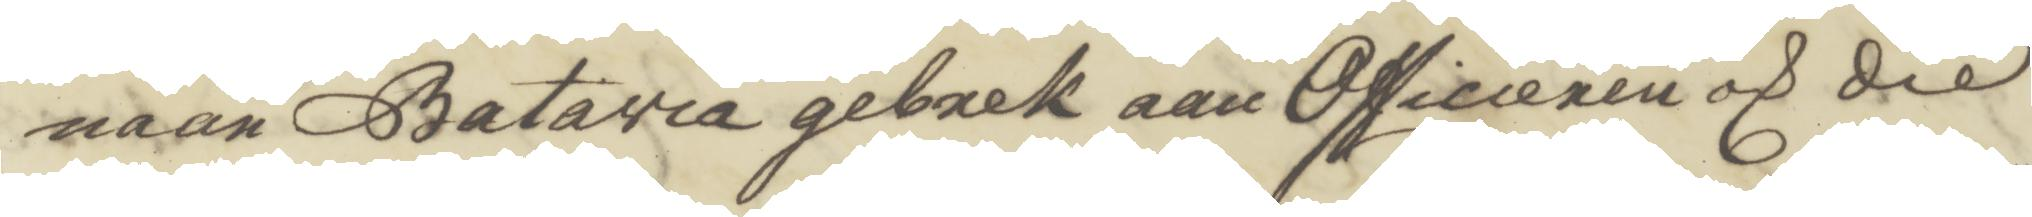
naar Batavia gebrek aan Officieren over die
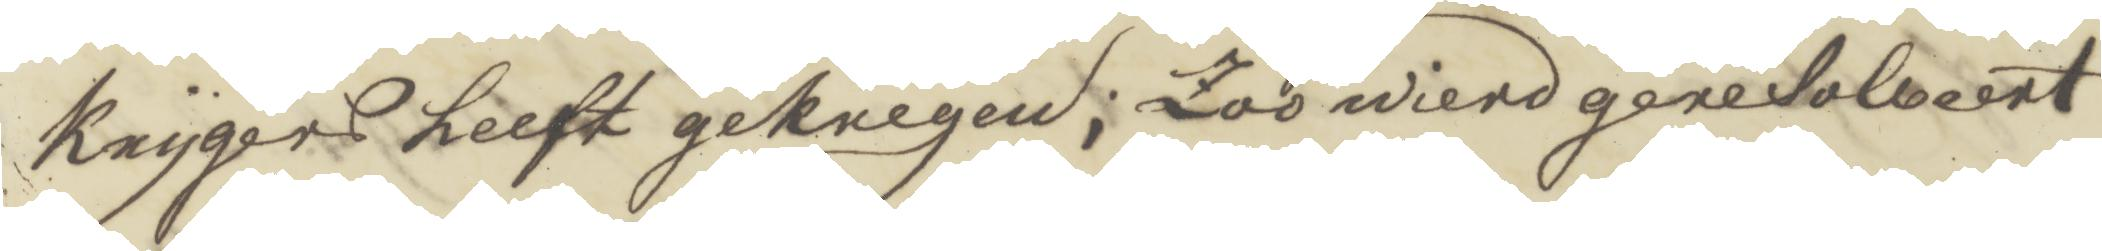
krijgers heeft gekregen; zoo wierd geresolveert
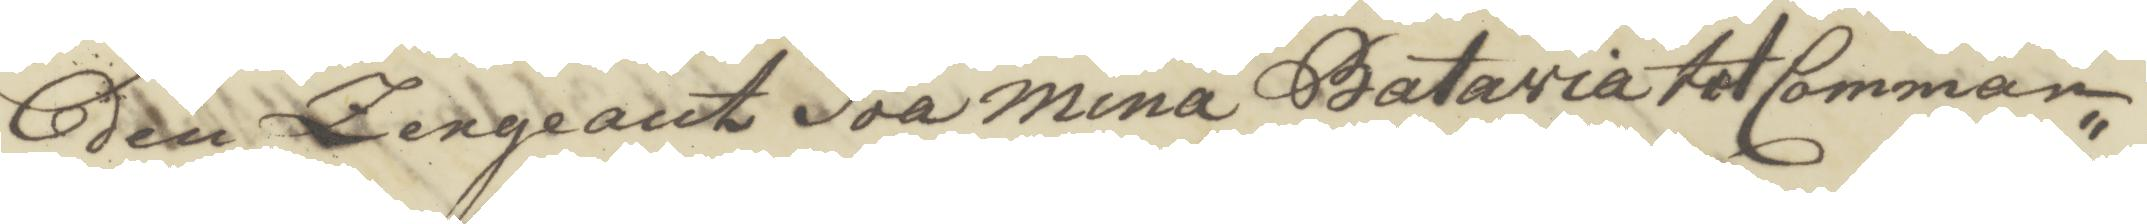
den zergeant Toa mina Batavia tot Comman„
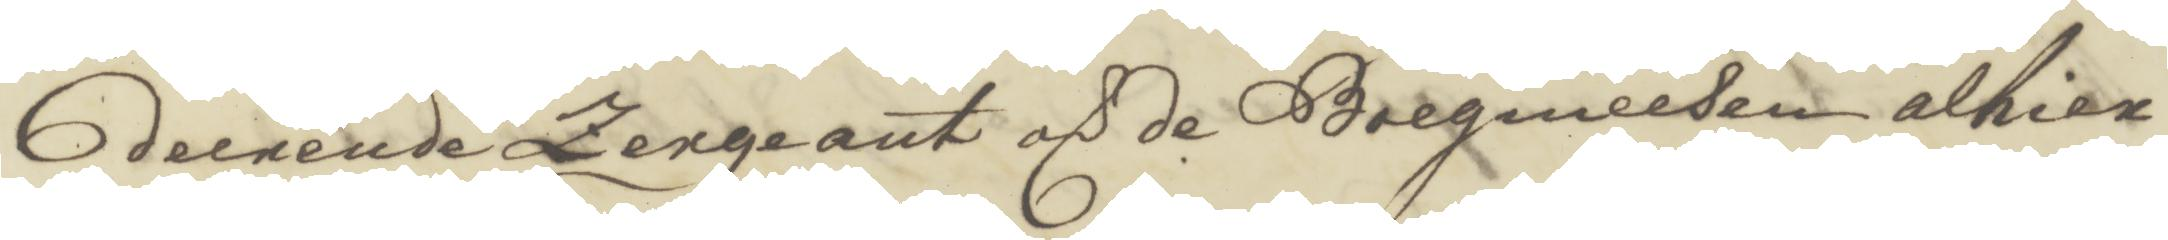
deerende zergeant over de Boegineesen alhier
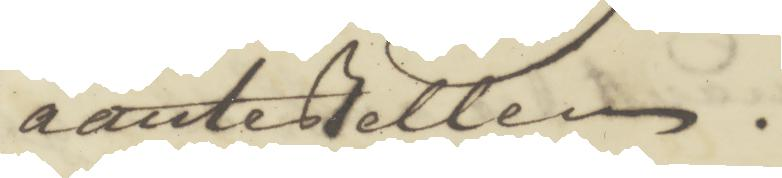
aantestellen.
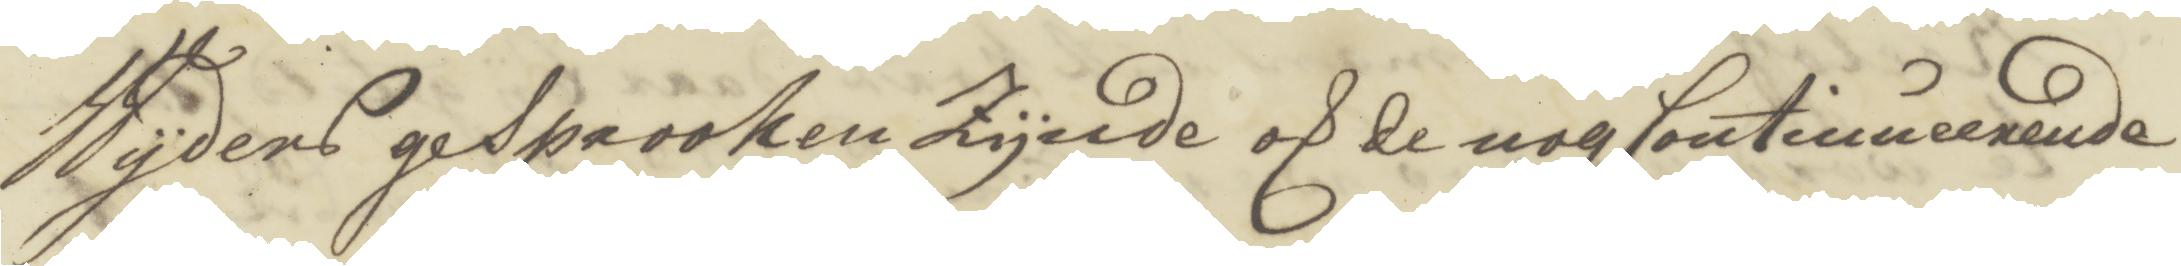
Wijders gesprooken zijnde over de nog continueerende
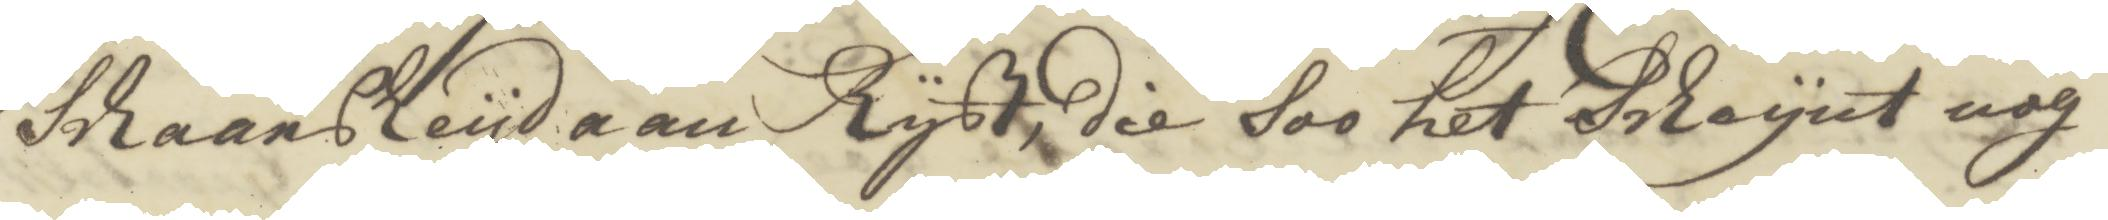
schaarsheijd aan Rijst, die soo het schijnt nog
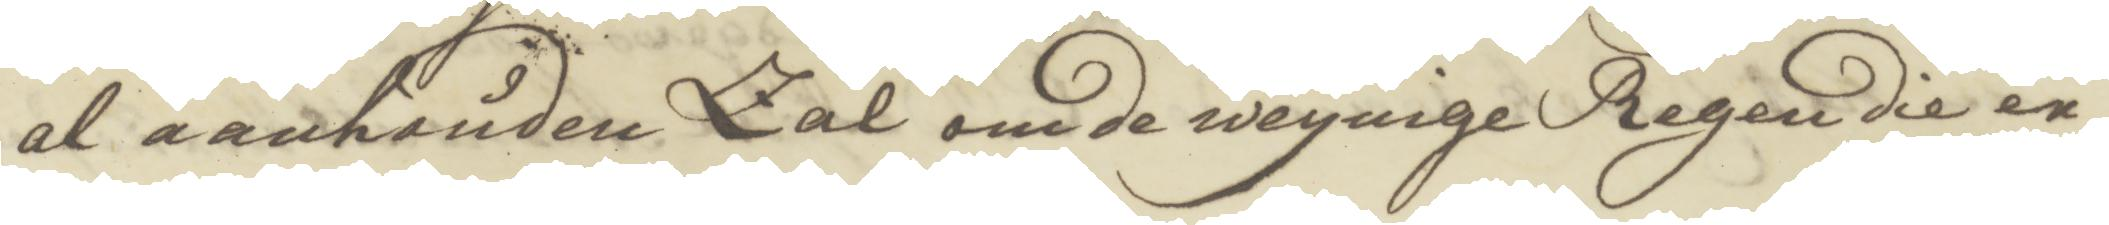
al aanhouden zal om de weijnige Regen die 'er
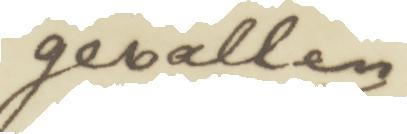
gevallen
